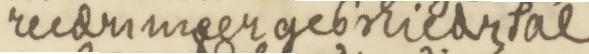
reeden meer geschieden sal
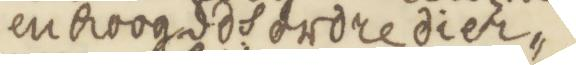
en hoog Ed:s ordre dier„
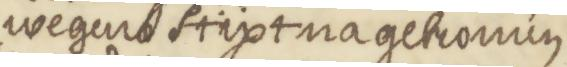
„wegens stipt na gekomen
